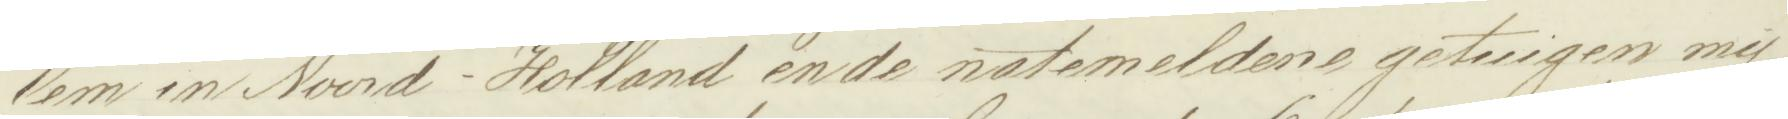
lem in Noord-Holland en de na te meldene getuigen mij
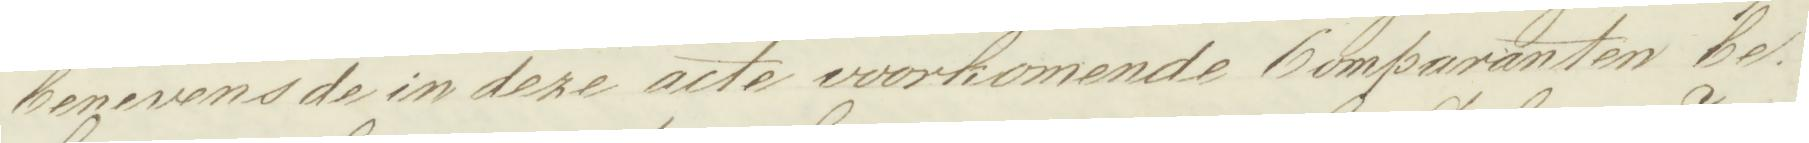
benevens de in deze acte voorkomende Comparanten be„
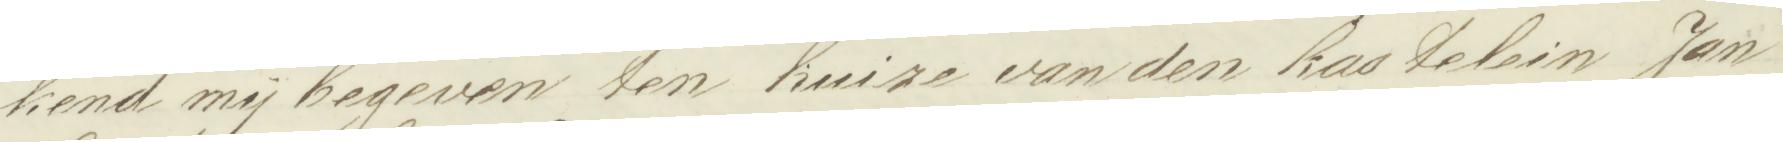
kend mij begeven ten huize van den kastelein Jan
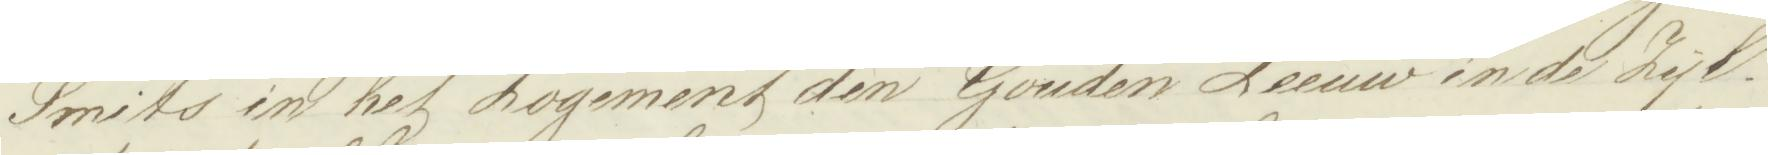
Smits in het Logement den Gouden Leeuw in de Zijl„
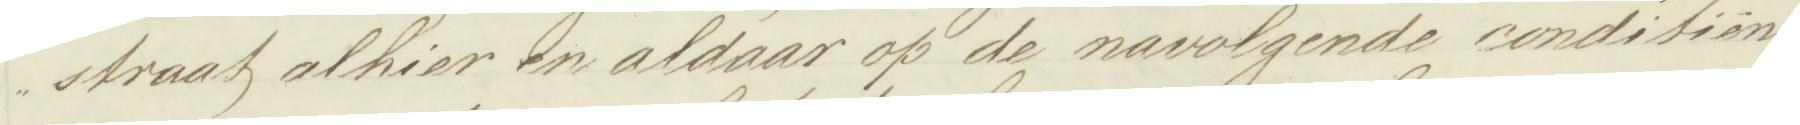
„straat alhier en aldaar op de navolgende conditien
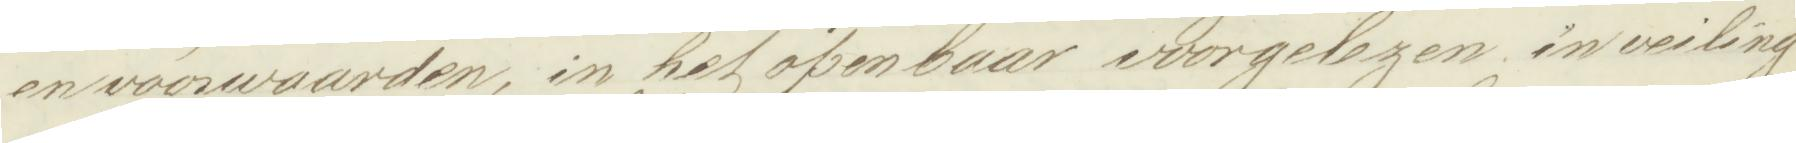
en voorwaarden, in het openbaar voorgelezen, in veiling
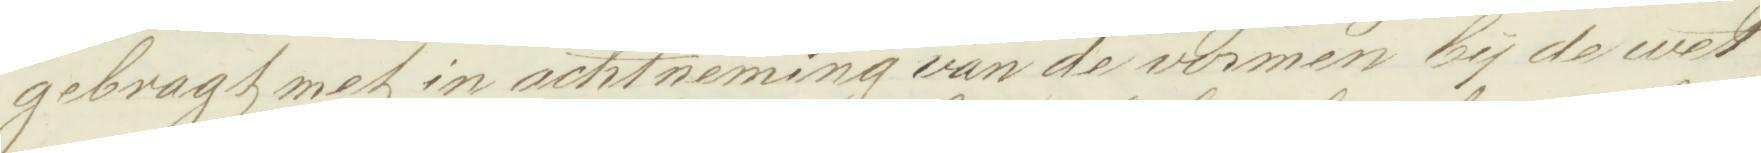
gebragt met in achtneming van de vormen bij de wet
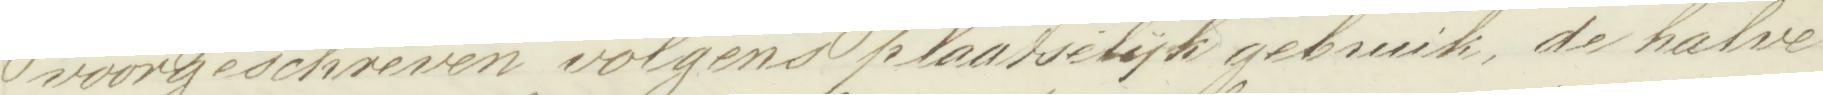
voorgeschreven volgens plaatselijk gebruik, de halve
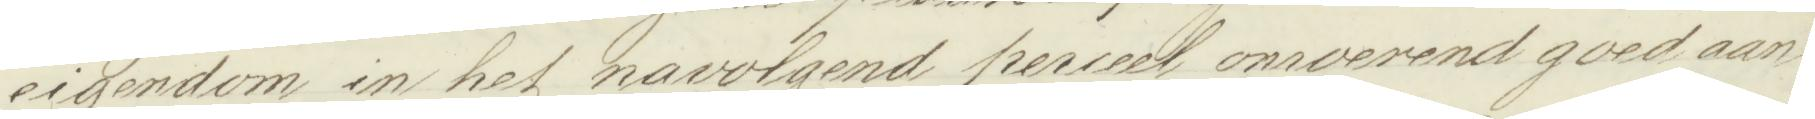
eigendom in het navolgend perceel onroevend goed aan
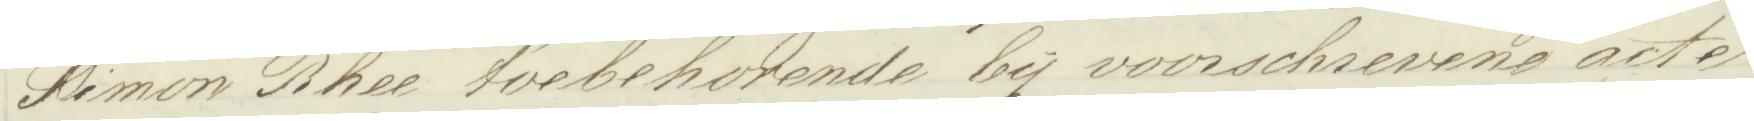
Simon Rhee toebehorende bij voorschrevene acte
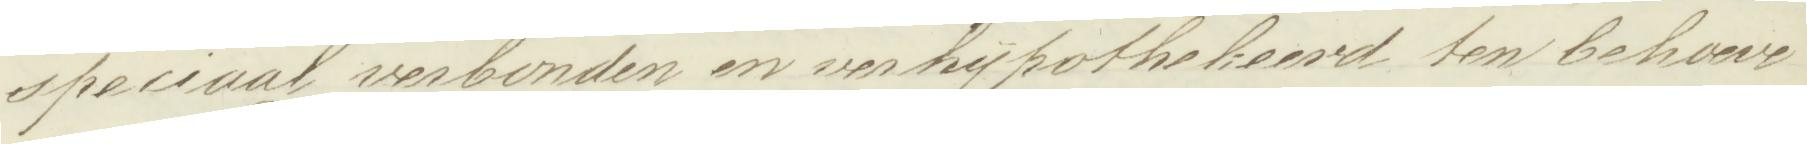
speciaal verbonden en verhijpothekeerd ten behoeve
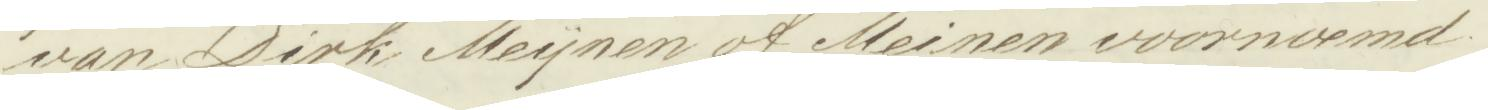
van Dirk Meijnen of Meinen voornoemd
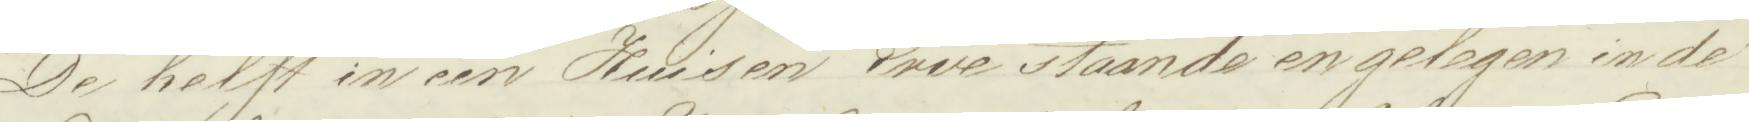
De helft in een Huisen Erve staande en gelegen in de
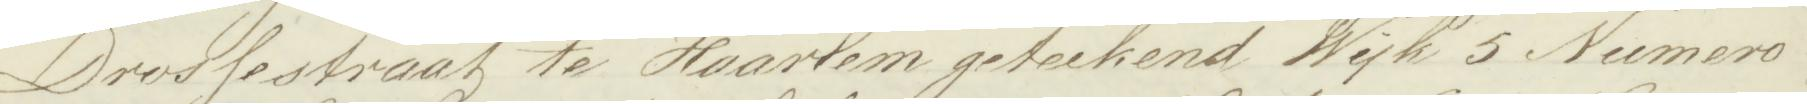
Drossestraat te Haarlem geteekend Wijk 5 Numero
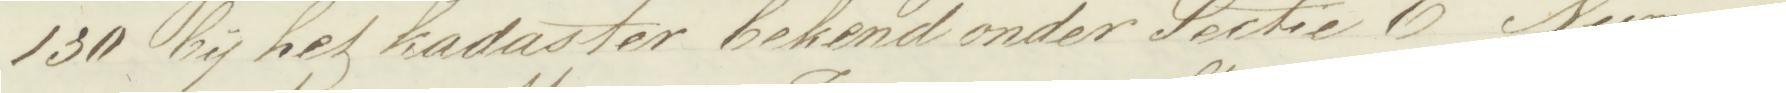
130 bij het kadaster bekend onder Sectie 6 Numero
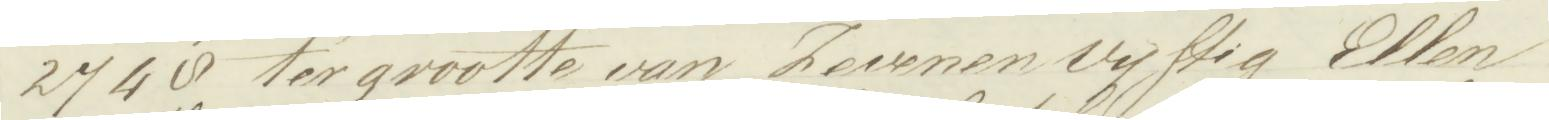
2748 ter grootte van Zevenen vijftig Ellen
